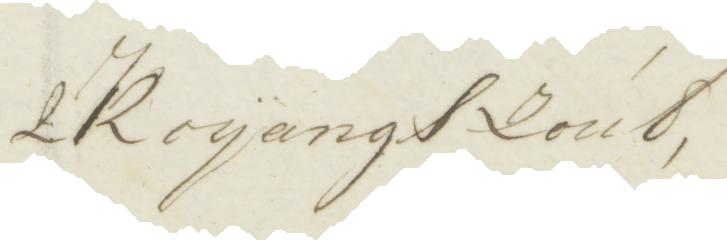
2 Roijangs zout,
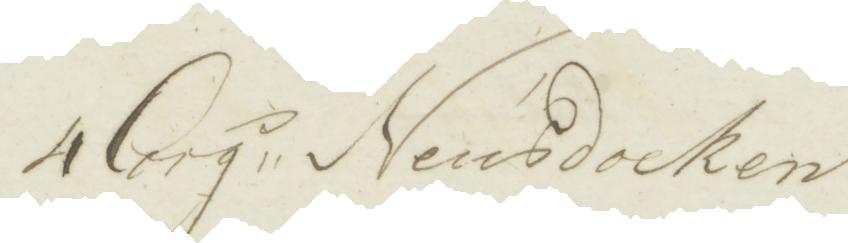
4 Corg„s Neusdoeken
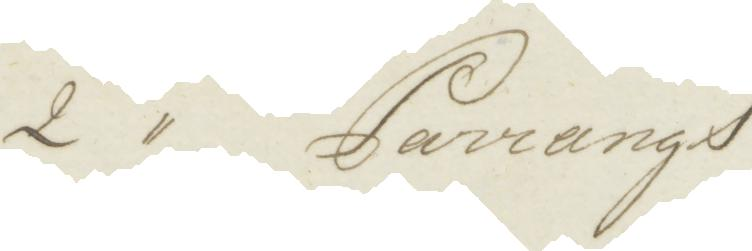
2 „ Parrangs
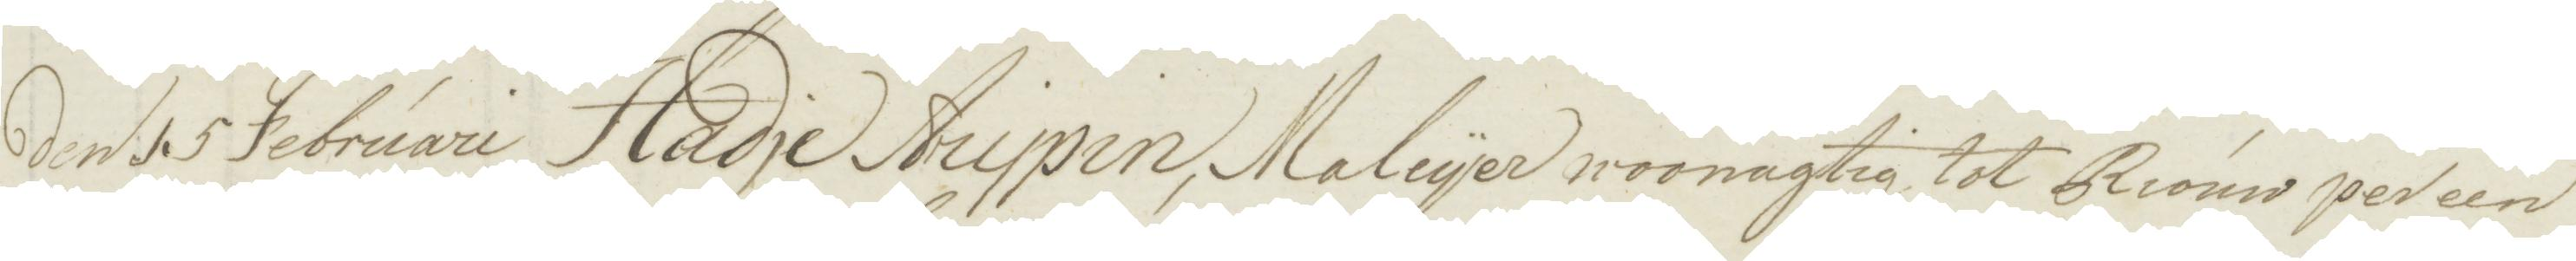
den 15 Februari Hadje Arippin, Maleijer woonagtig tot Riouw per een
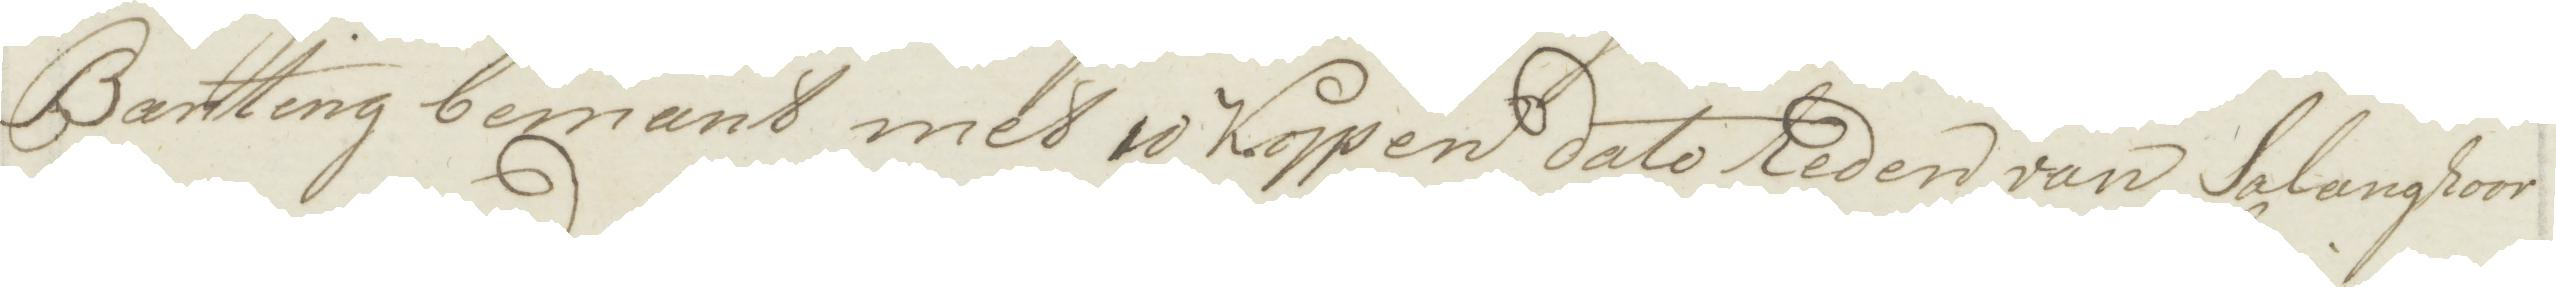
Banting bemant met 10 Koppen dato heden van Salanghoor
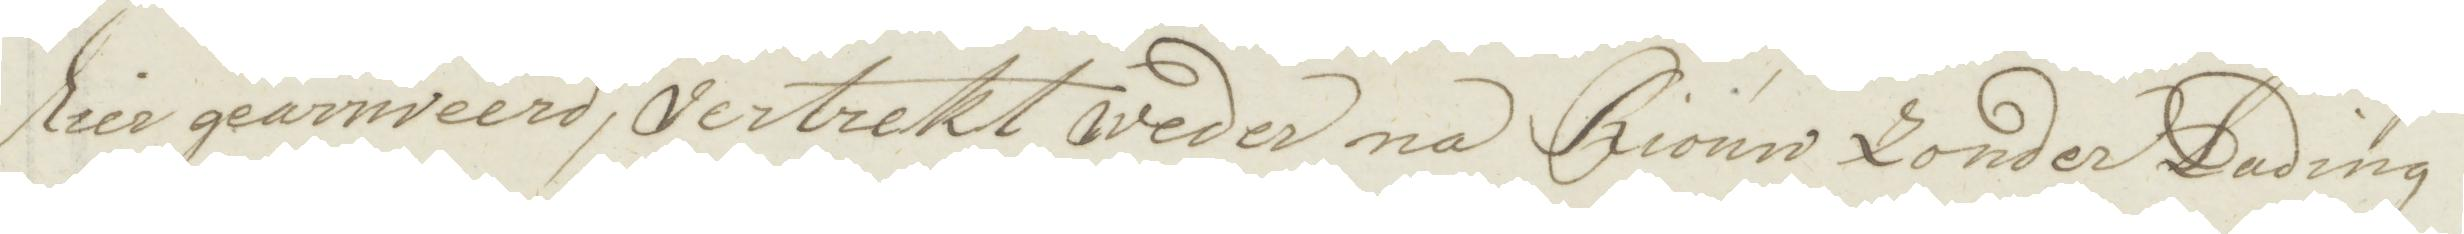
hier gearriveerd, vertrekt weder na Riouw zonder Lading
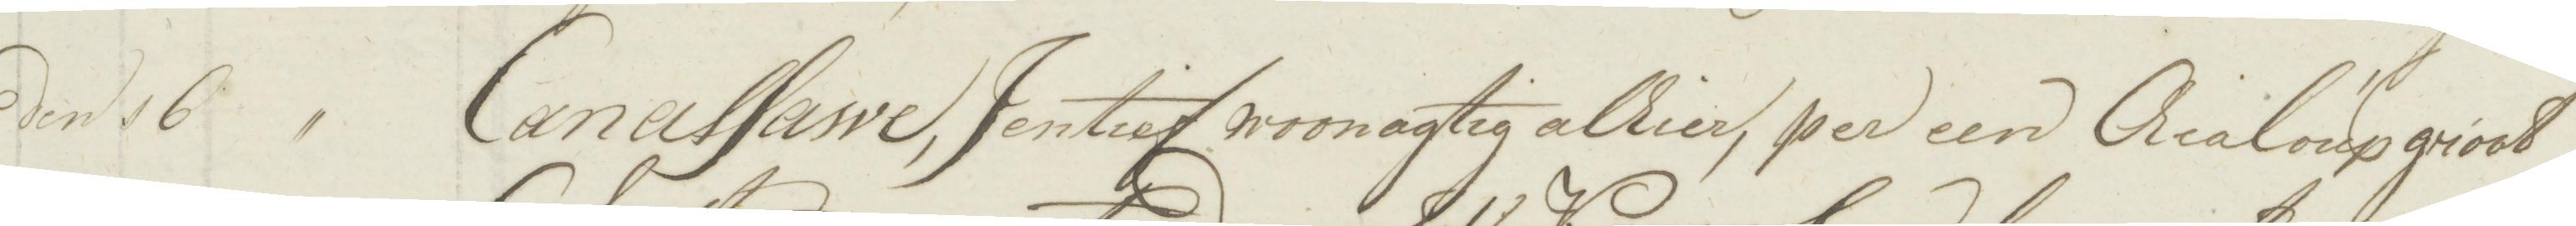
den 16 „ Canassawe, Jentief woonagtig alhier, per een Chialoup groot
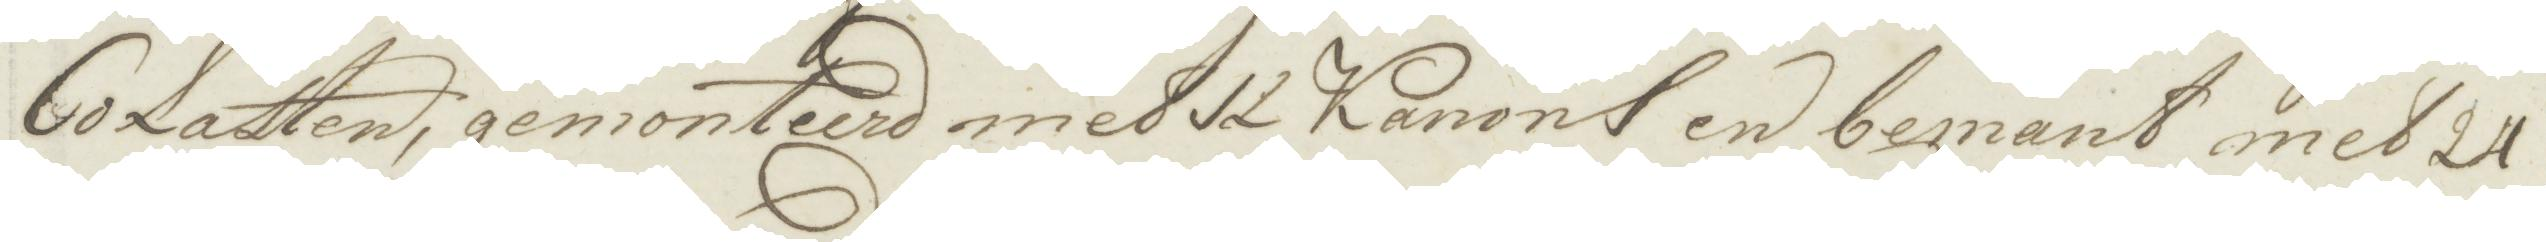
60 Lasten, gemonteerd met 12 Kanons en bemant met 24
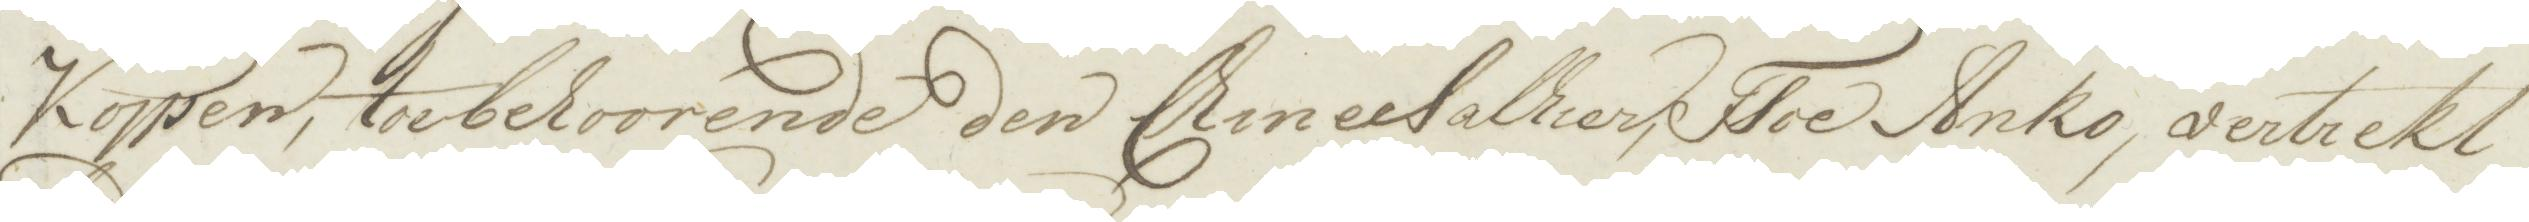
Koppen, toebehoorende den Chinees alhier, Tsoe Anko, vertrekt
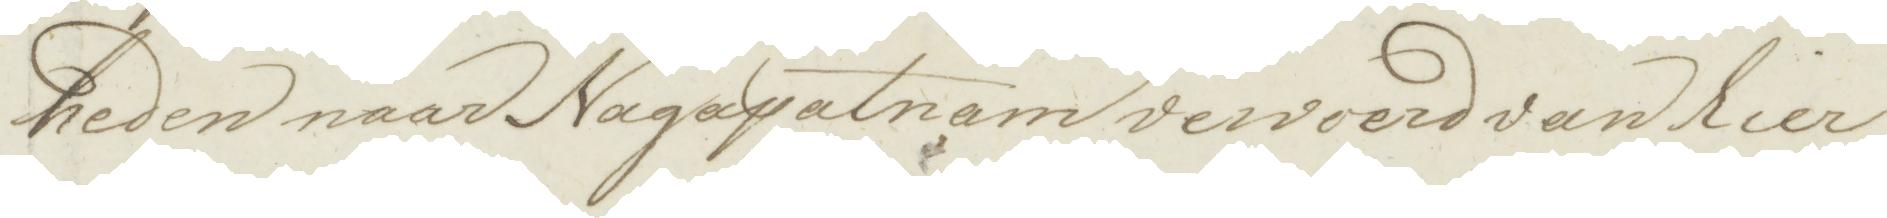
heden naar Nagapatnam vervoerd van hier
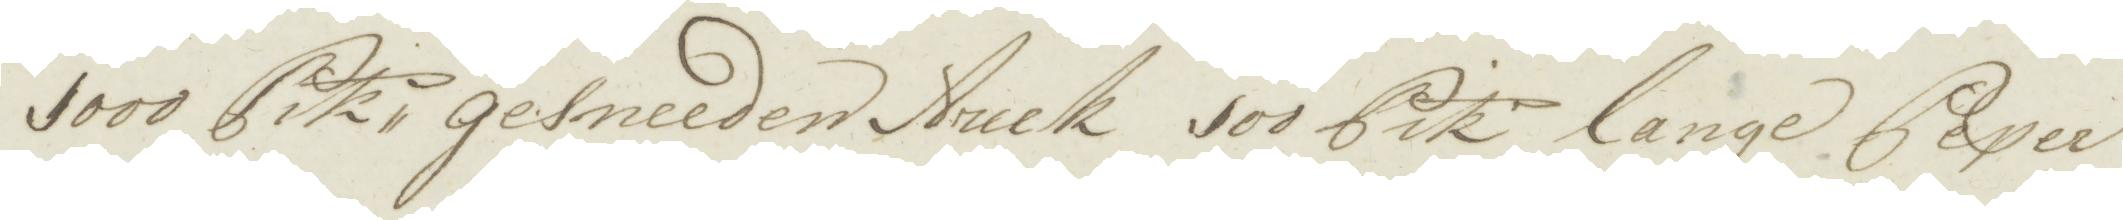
1000 Pik„s gesneeden Areek soo Pik:s lange Peper
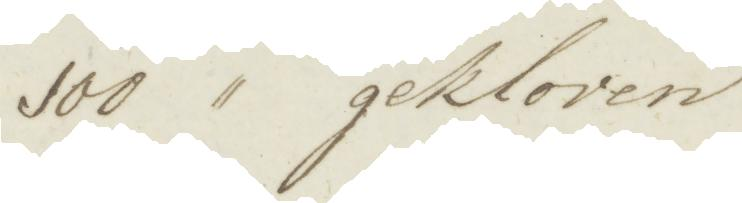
100 „ gekloven
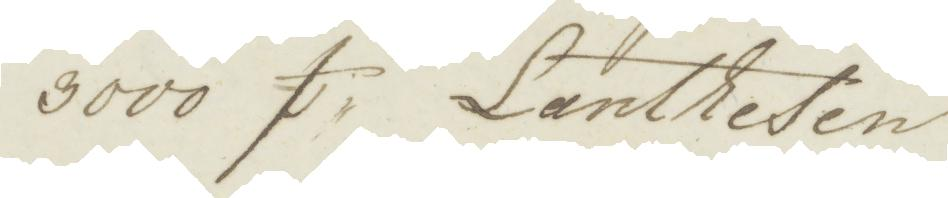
3000 p:s Lanthesen
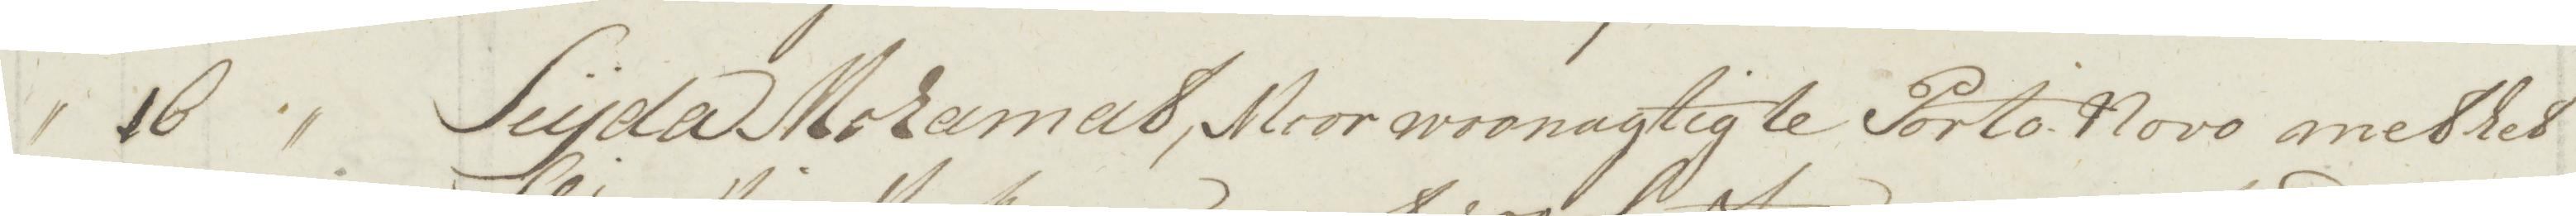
„ 16 „ Seijda Mohamat, Moor woonagtigte Porto Novo met het
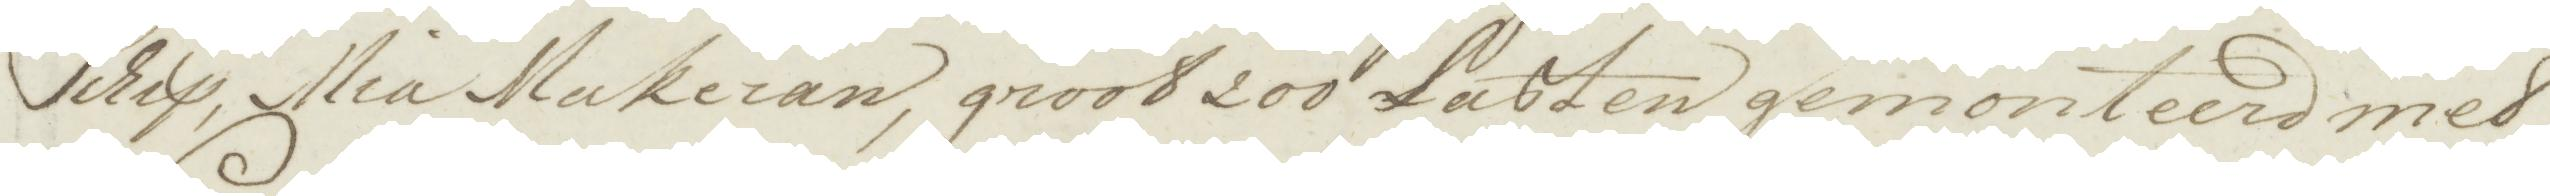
schip, Mia Makeran, groot 200 Lasten gemonteerd met
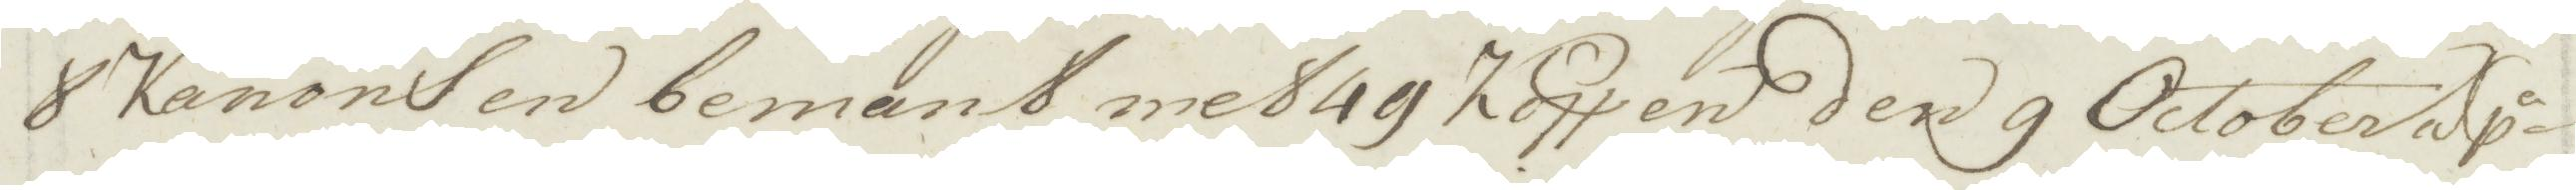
8 Kanons en bemant met 49 Koppen den 9 October a p-o
